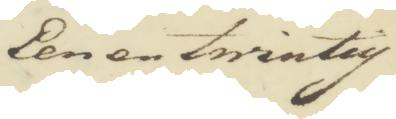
Een en twintig
